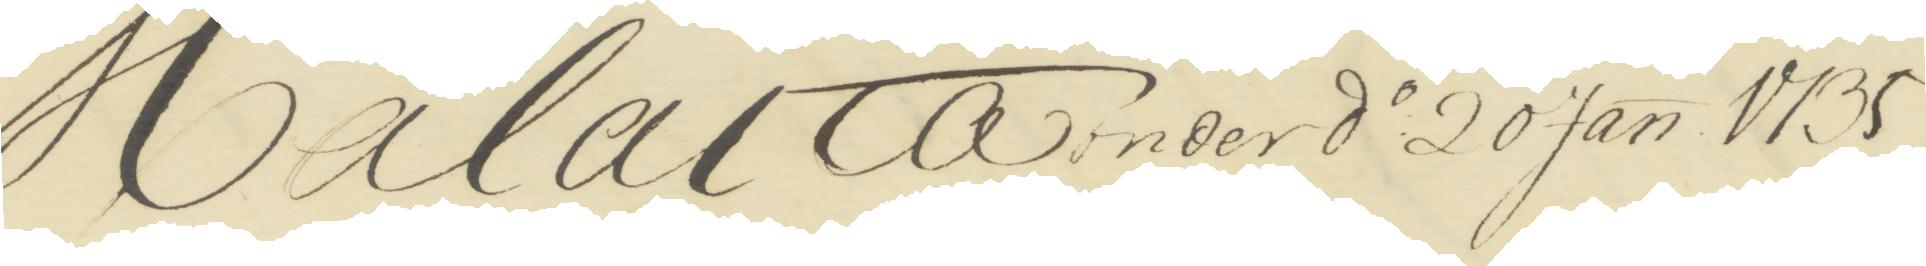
Van Malacca onder d:o 20 Jan 1735
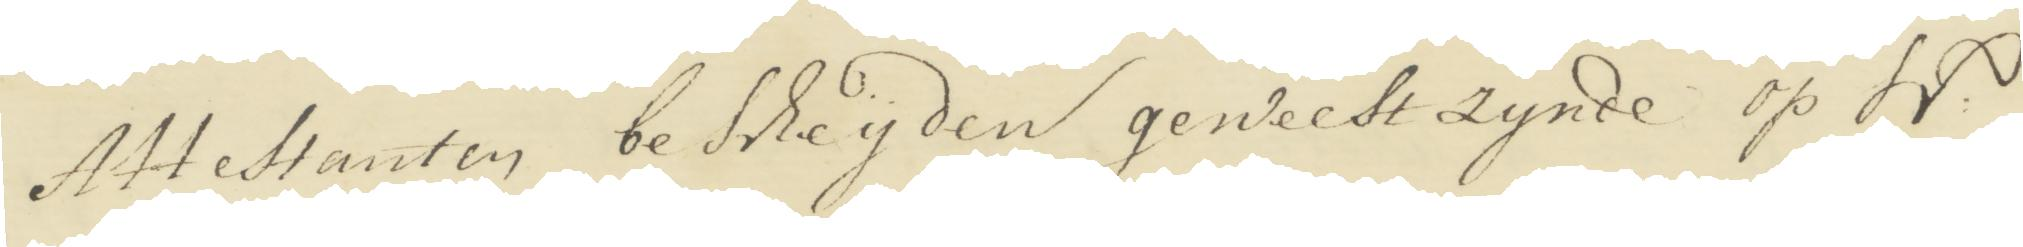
Attestanten bescheijden geweest zijnde op sE.
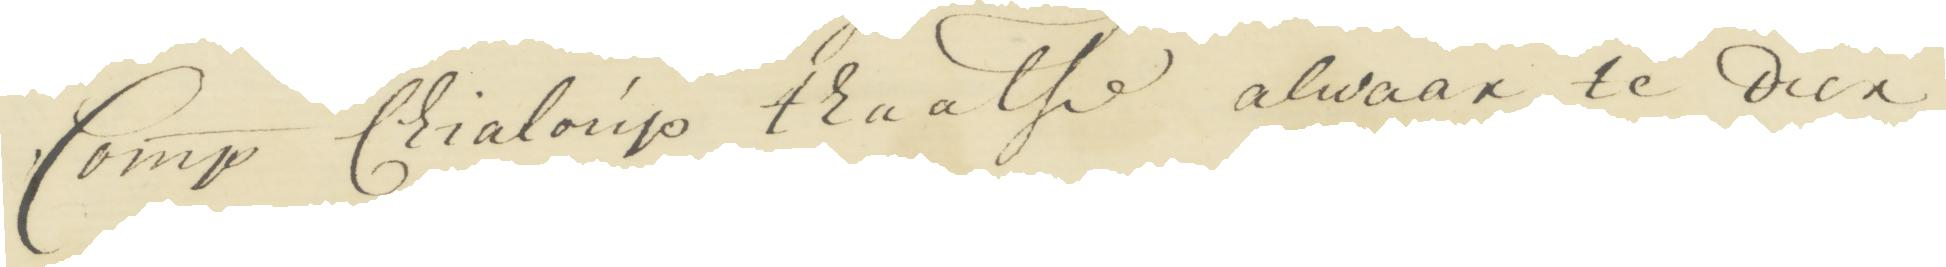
Comp chialoup thaalse alwaar te dier
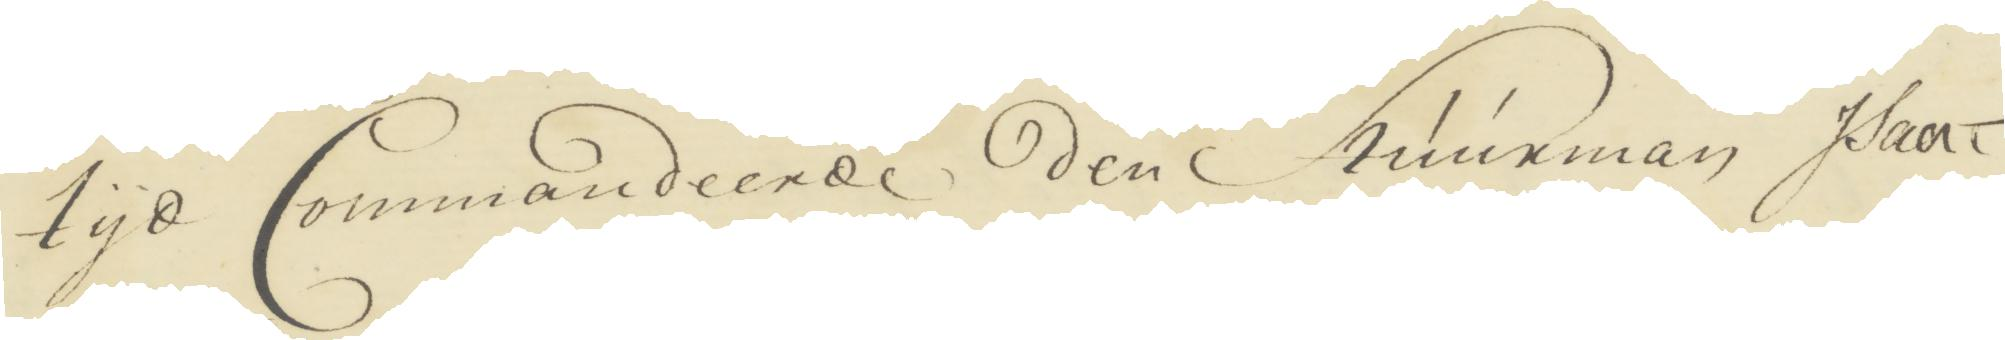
tijd Commandeerde den stuurman Jsaac
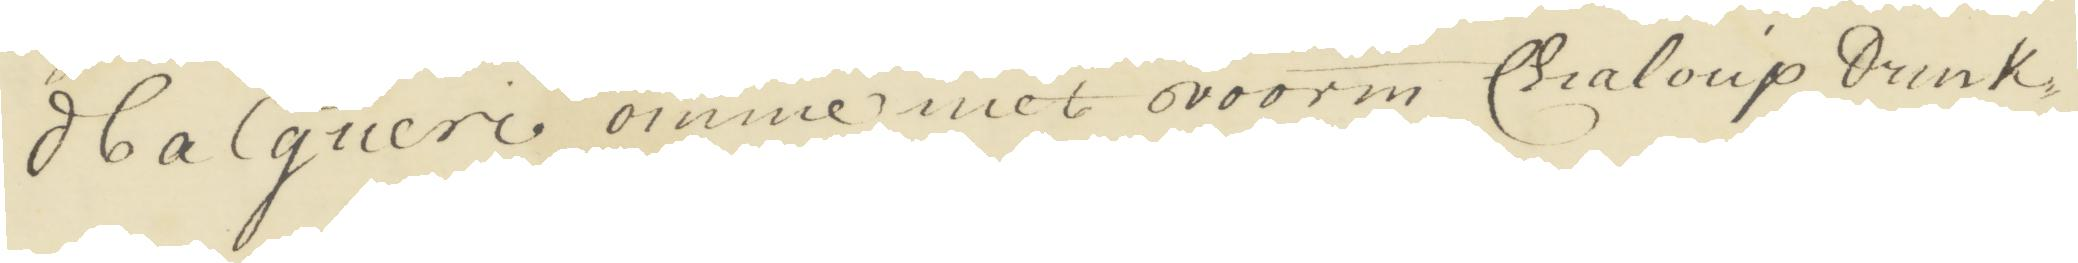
dbalgueri omme met voorm chaloup drink„
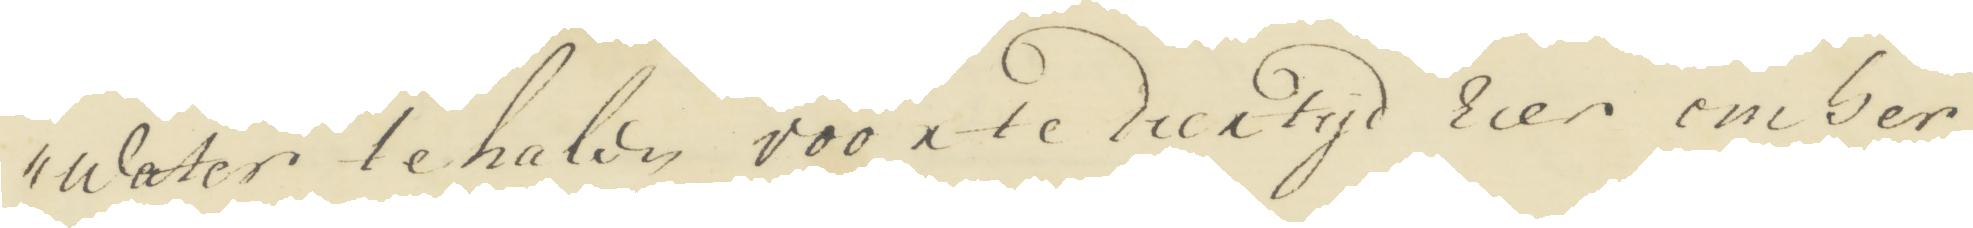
„water te halen voor te dier tijd hier en dert
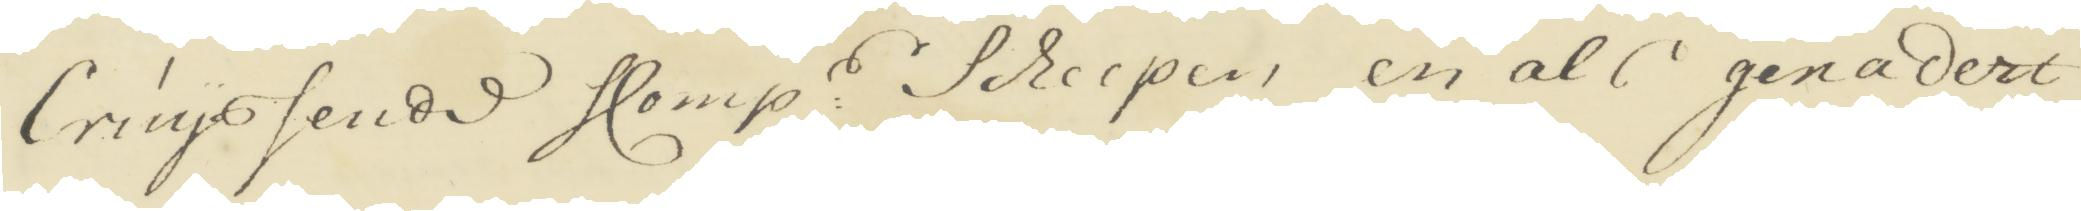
cruijssende sComp:s scheepen en al 6 genadert
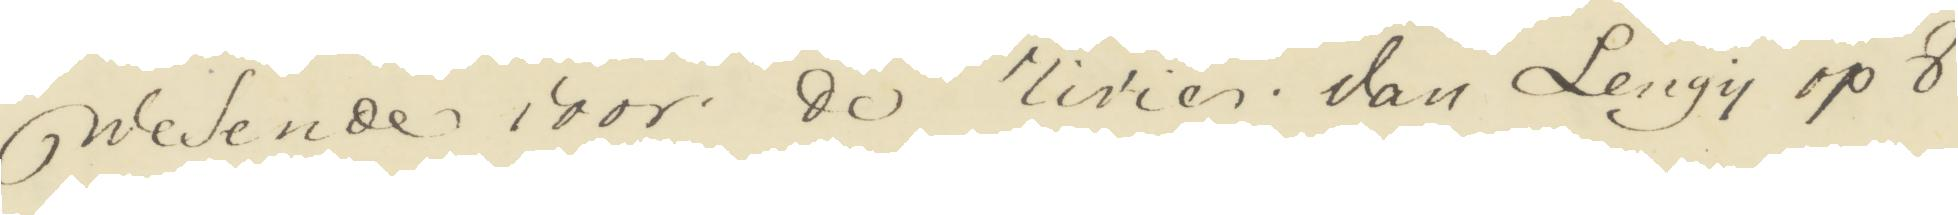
wesende voor de rivier van Lengij op 8
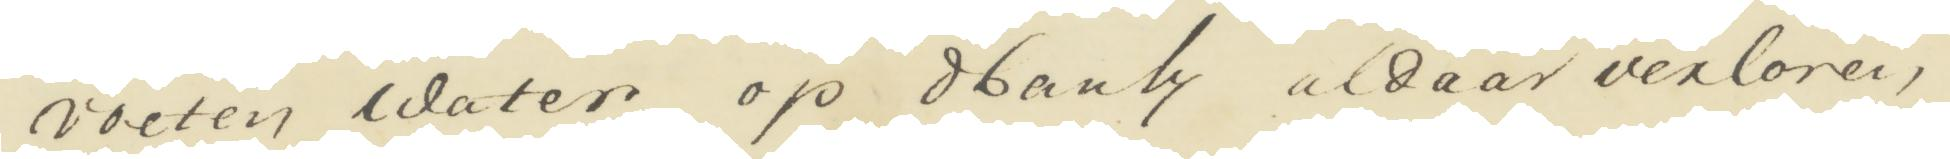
voeten water op de bank aldaar verloren
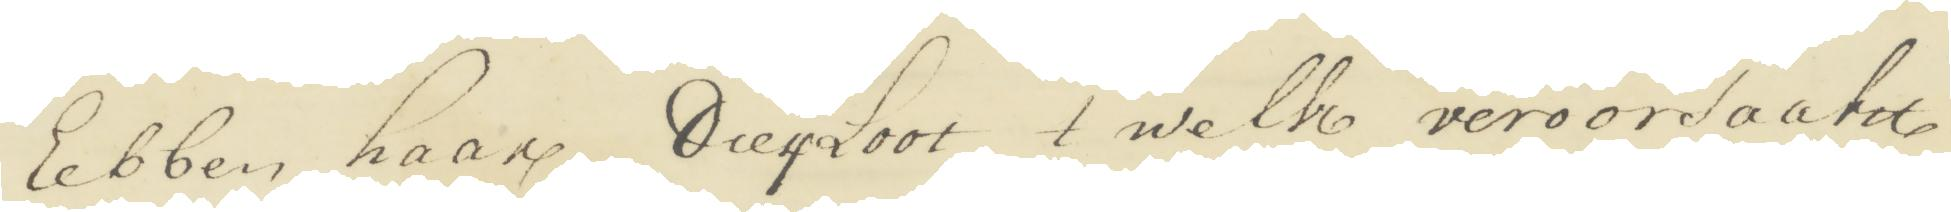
hebben haar dieploot 't welk veroorsaakt
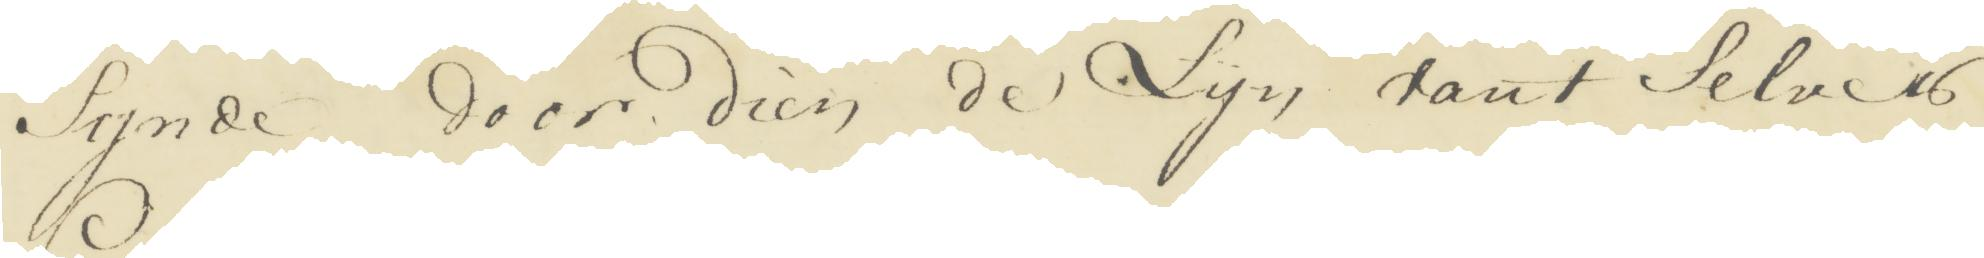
synde doon dien de Lijn vant selvers
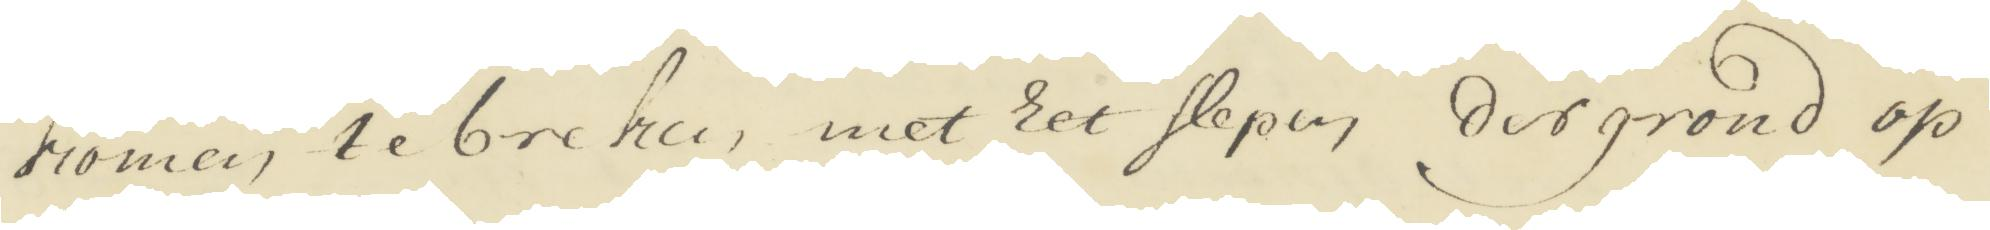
komen te breken met het slepen des grond op
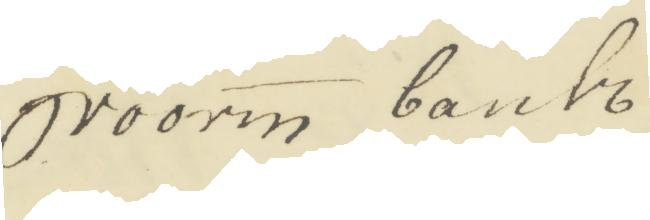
voorm bank
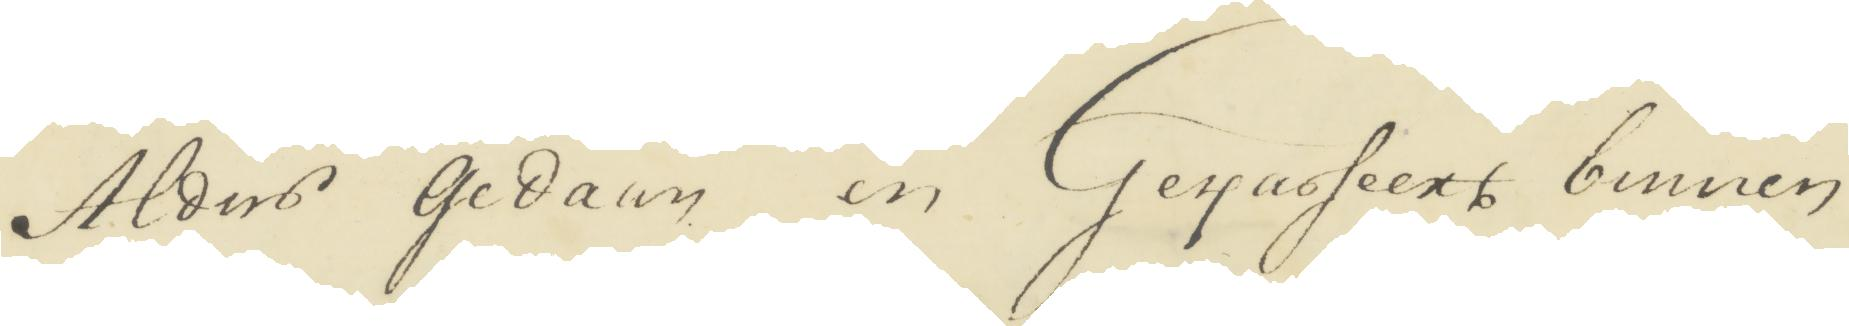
Aldus gedaan en Gepasseert binnen
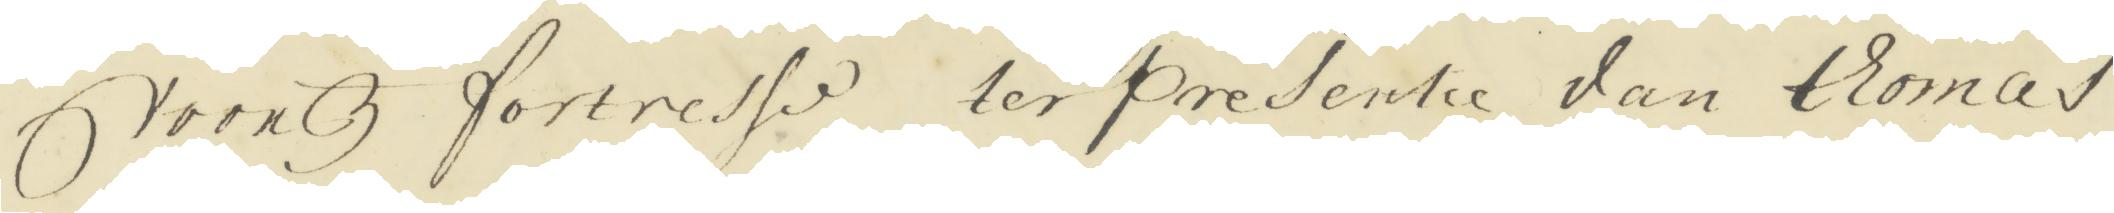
voorz fortresse ter presentie van thomas
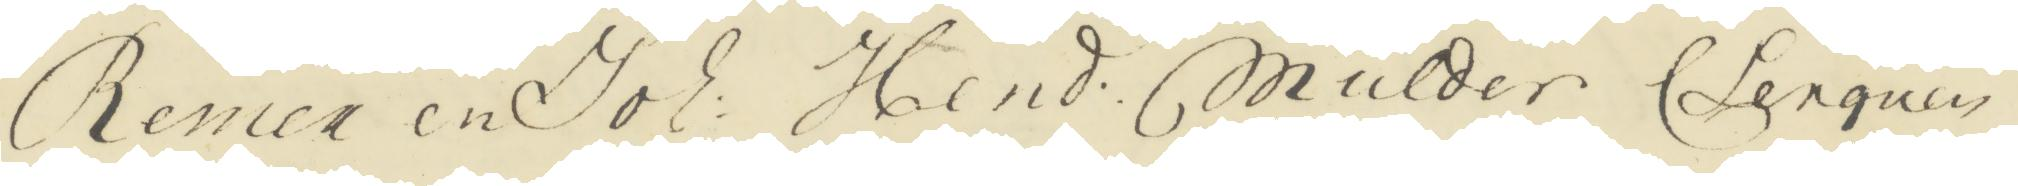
Renier en Joh: Hend: Mulder Clerquen
